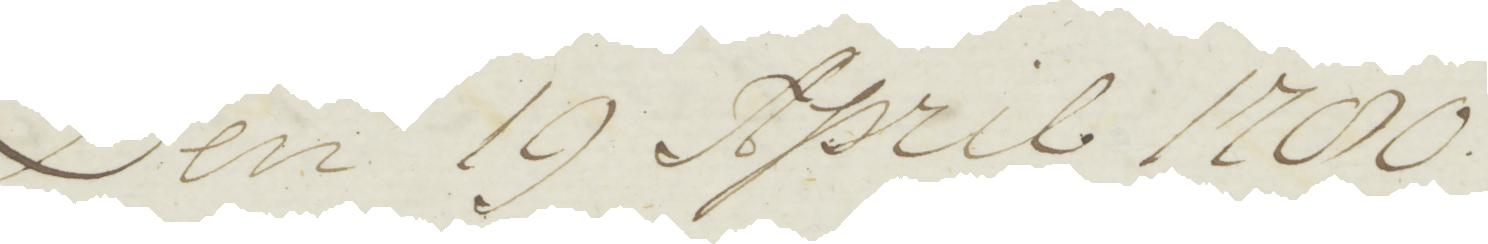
Den 19: April 1780.
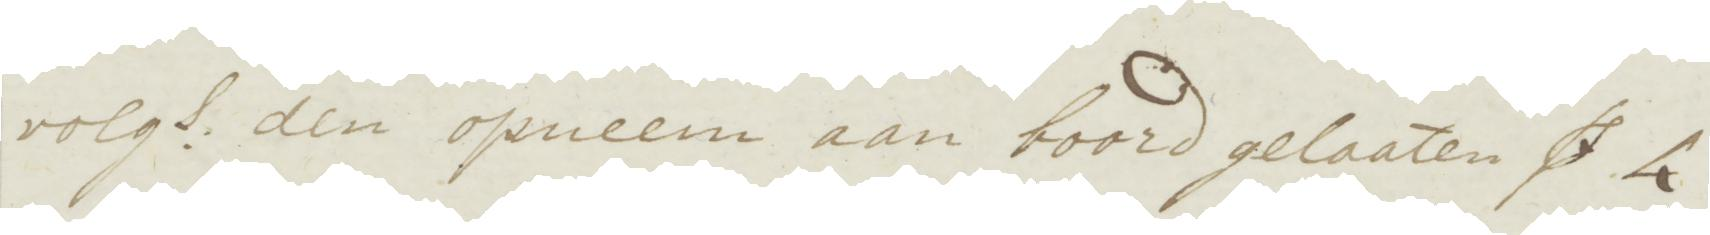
volgs. den opneem aan boord gelaaten ps 4
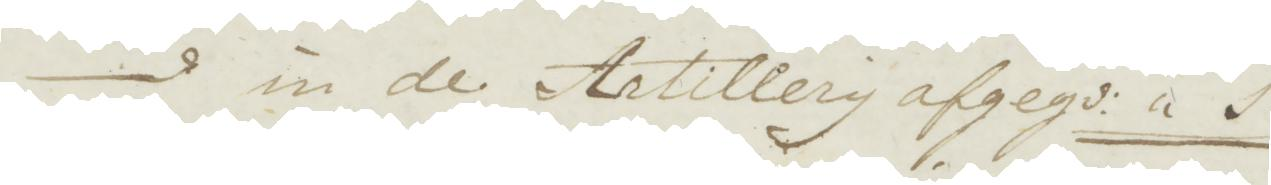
_o in de Artillerij afgege: a 1
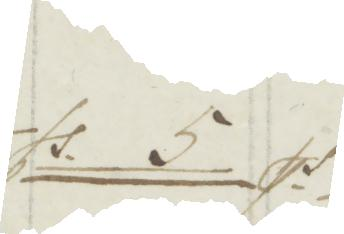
ps 5 p-s
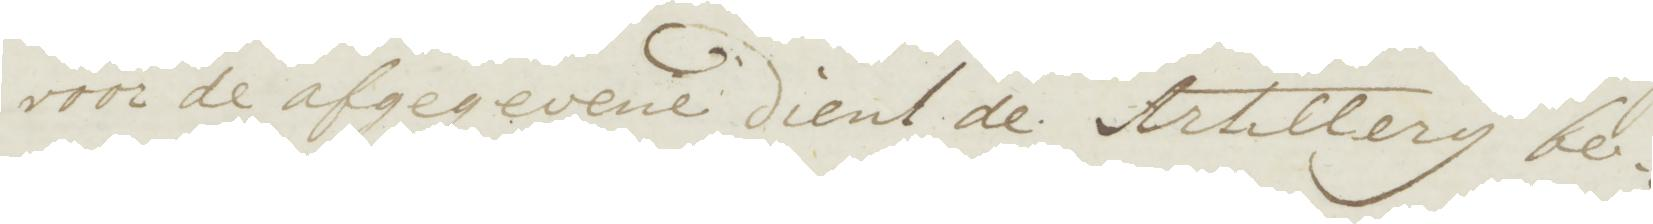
voor de afgegevene dient de Artillery be„
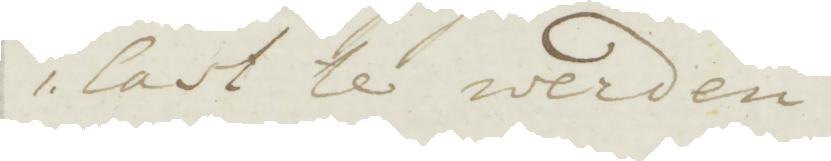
„last te werden
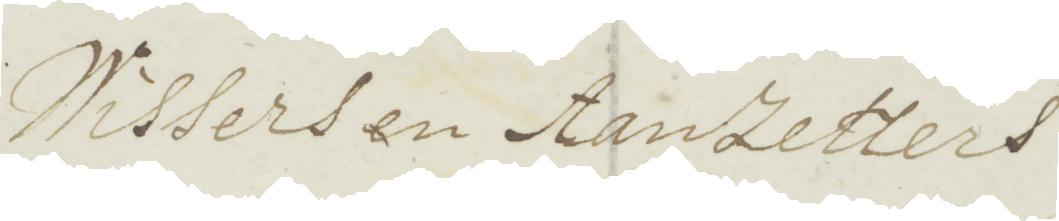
Wissers en Aanzetters
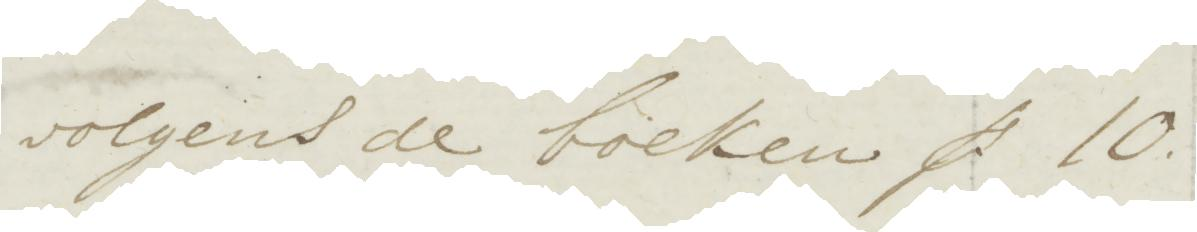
volgens de boeken ps 10.
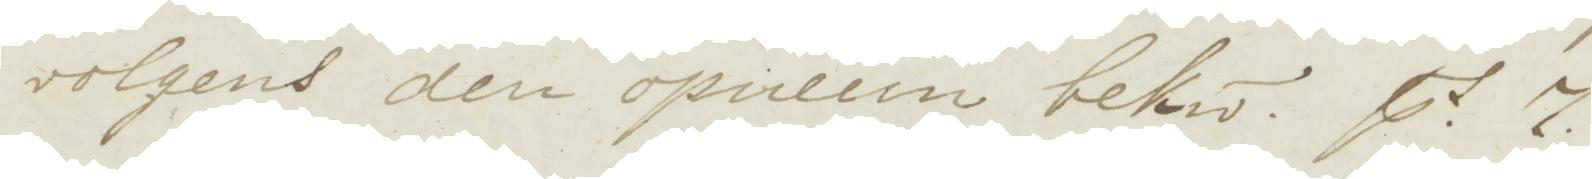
volgens den opneem bekw: p.s 7.
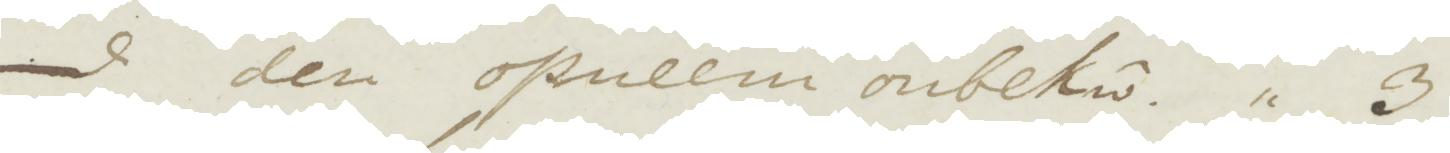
_o den opneem onbekw. „ 3
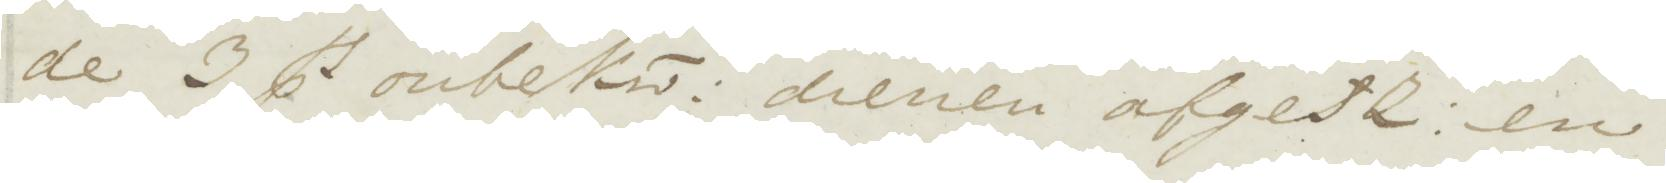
de 3 ps onbekw: dienen afgesz: en
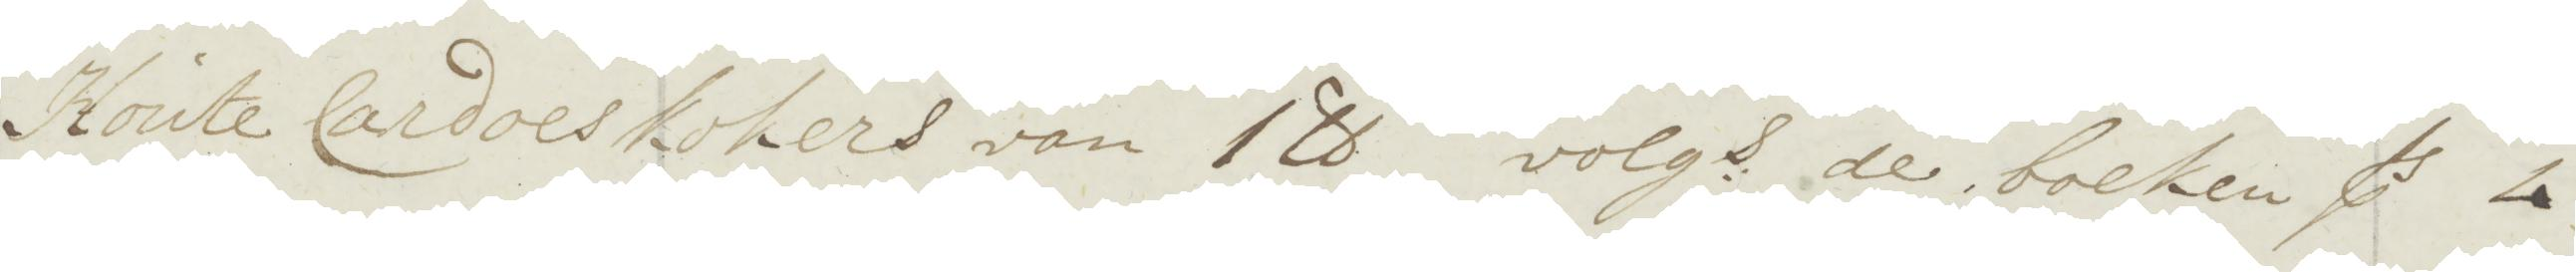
Houte Cardoes kokers van 1 lb volg:s de boeken ps. 4
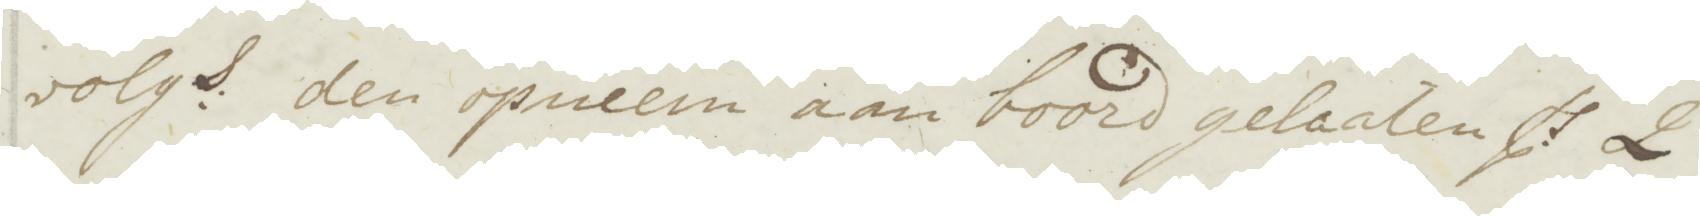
volg:s den opneem aan boord gelaaten ps 2
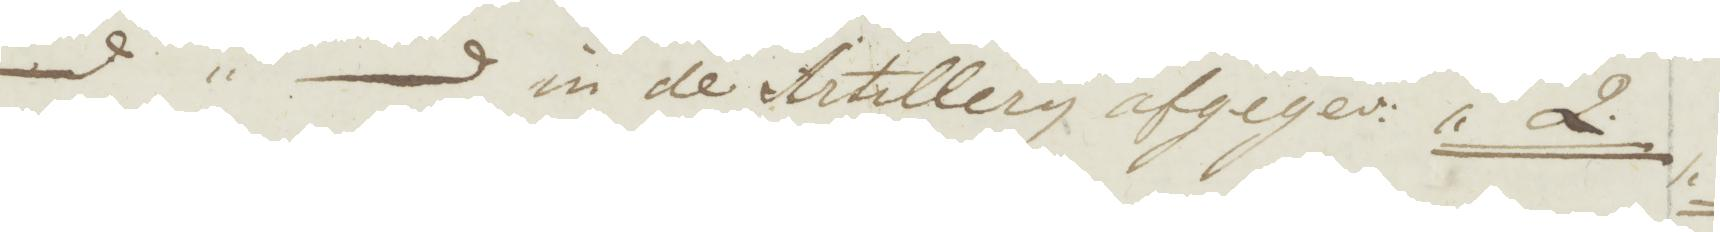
_o „ _o in de Artillery afgegev: „ 2:„
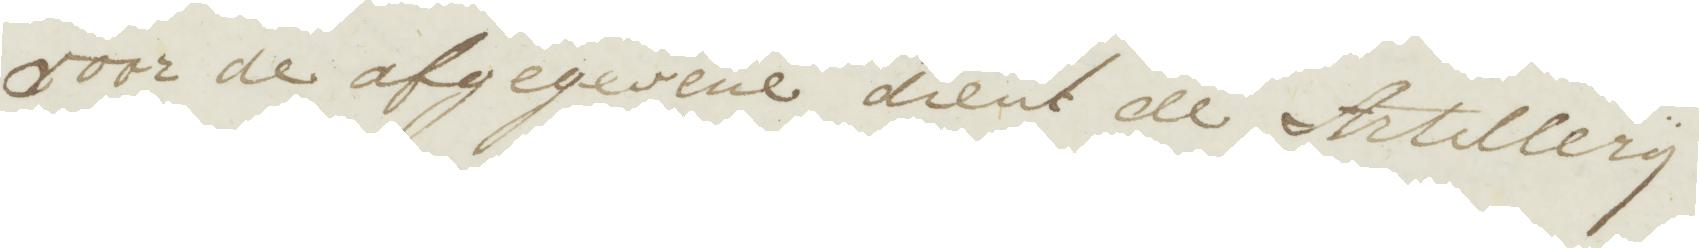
voor de afgegevene dient de Artillerij
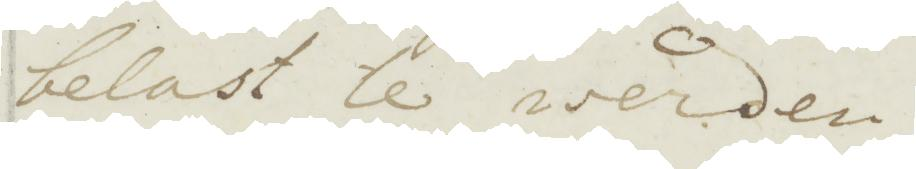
belast te werden
